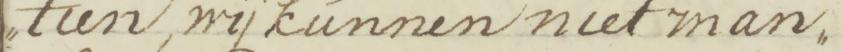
„tien, wij kunnen niet man„
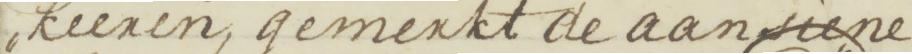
„keeren, gemerkt de aansiene
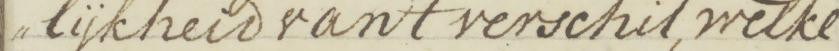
„lijkheid van ’t verschil, welke
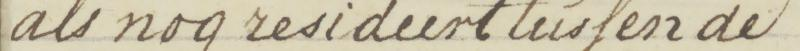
als nog resideert tussen de
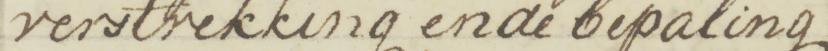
verstrekking ende bepaling
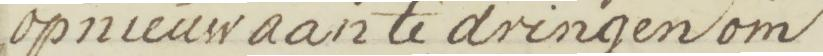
opnieuw aan te dringen om
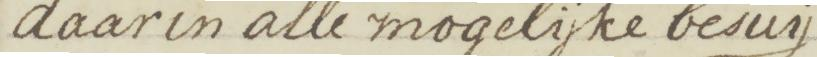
daar in alle mogelijke besuij
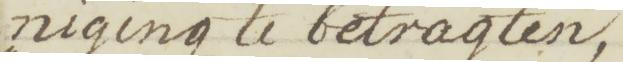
„niging te betragten,
